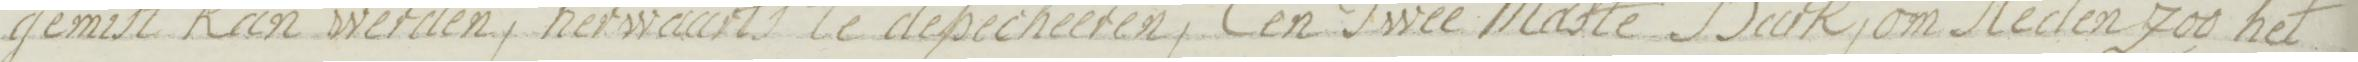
gemist kan werden, herwaarts te depecheeren, Een Twee Maste Bark, om Reden zoo het
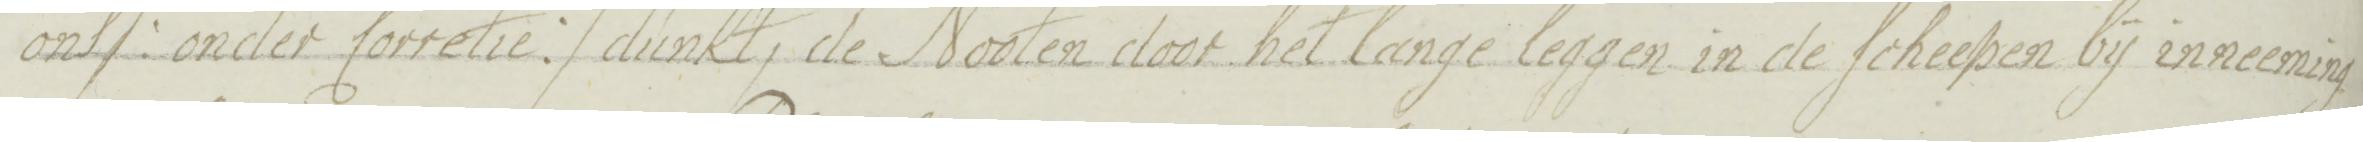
ons /:onder Corretie:/ dunkt, de Nooten door het lange leggen in de scheepen bij inneeming
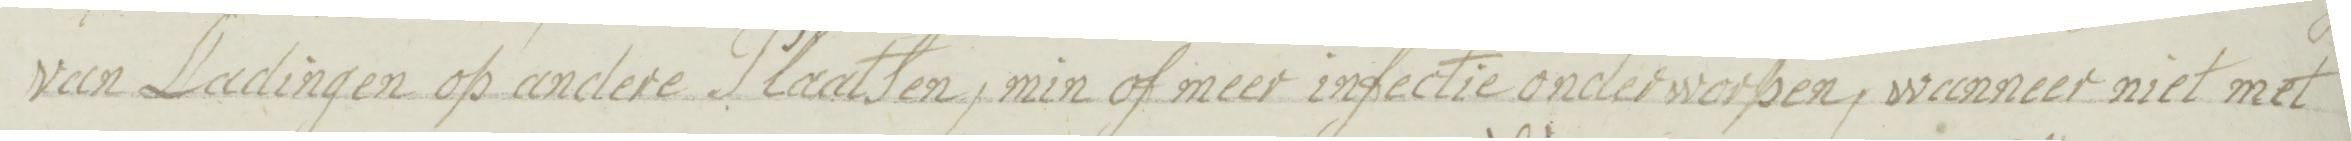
van Ladingen op andere Plaatsen, min of meer infectie onderworpen, wanneer niet met
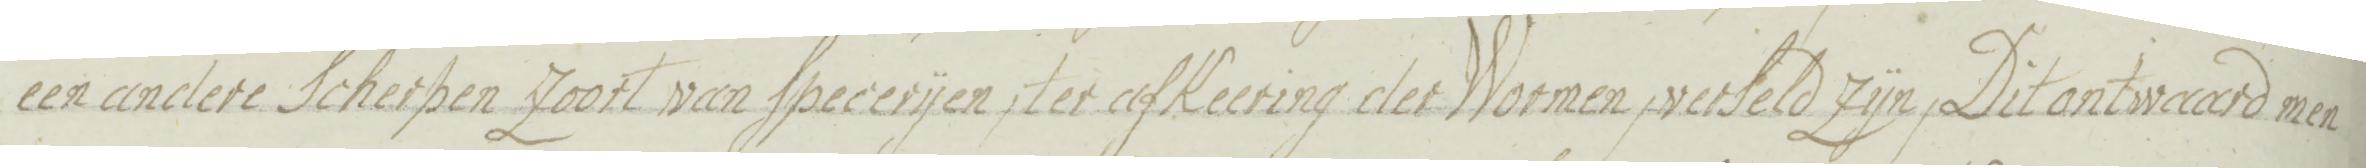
een andere scherpen zoort van specerijen, ter afkeering der wormen, verseld zijn, Dit ontwaard men
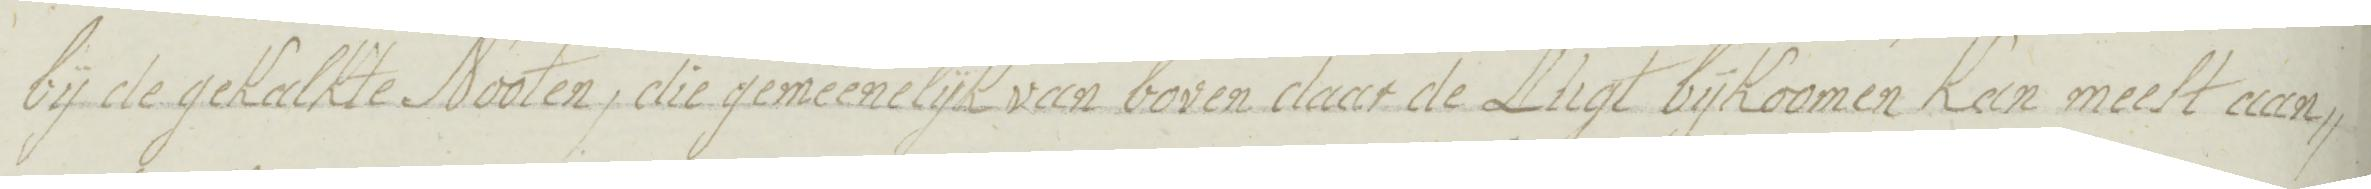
bij de gekalkte Nooten, die gemeenelijk van boven daar de Lugt bijkoomen kan meest aan„
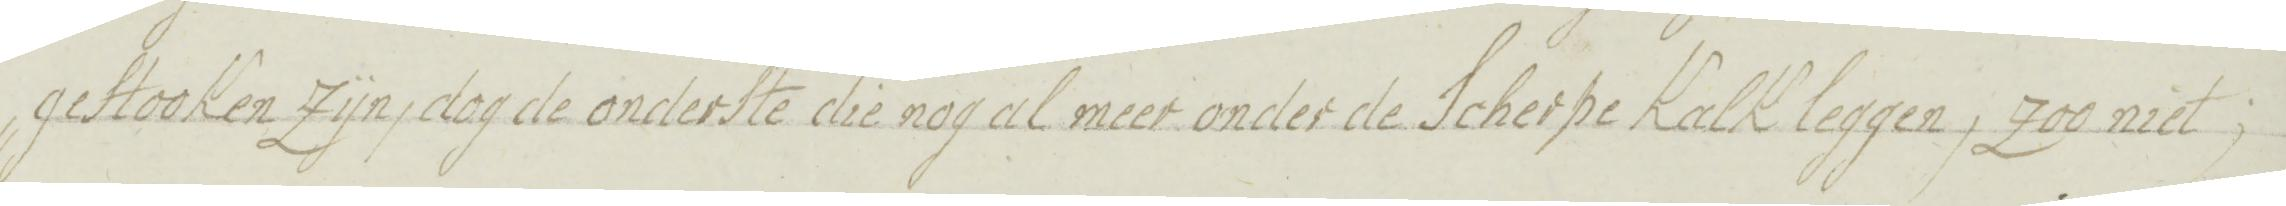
gestooken zijn, dog de onderste die nog al meer onder de scherpe Kalk leggen, zoo niet;
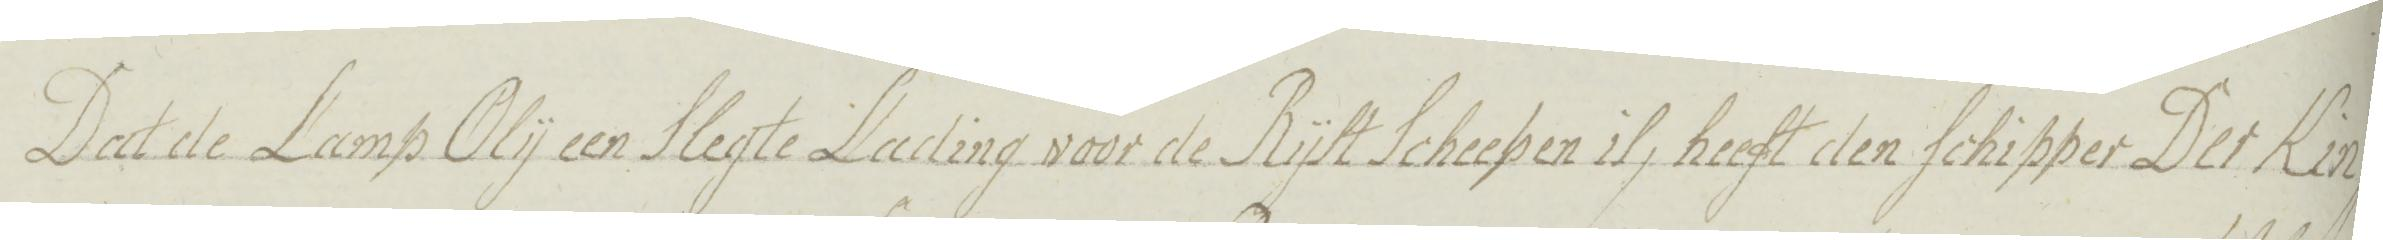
Dat de Lamp Olij een slegte Lading voor de Rijst scheepen is, heeft den schipper Der Kin
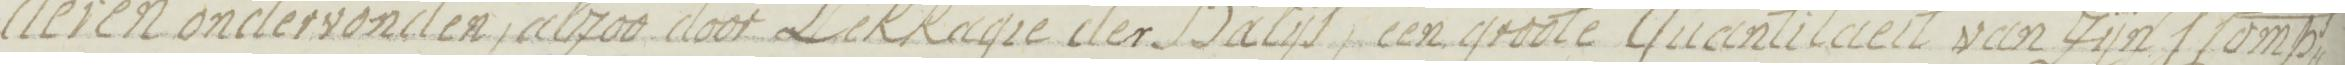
deren ondervonden, alzoo door Lekkagie der Balijs, een groote Quantitaeit van zijn 'S Comp„s
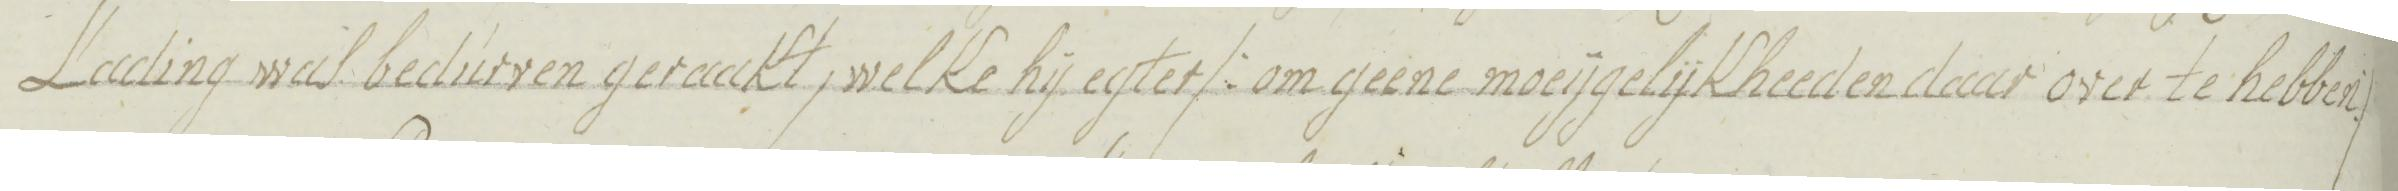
Lading was bedurven geraakt, welke hij egter /:om geene moeijgelijkheeden daar over te hebben:/
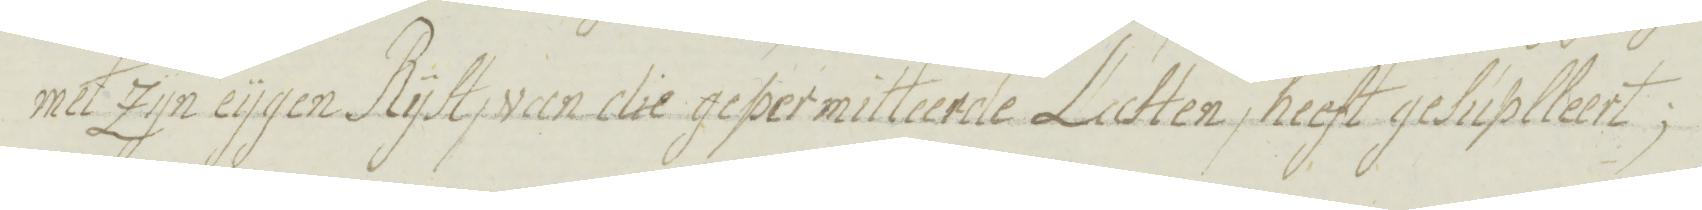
met zijn eijgen Rijst, van die gepermitteerde Lasten, heeft gesuplleert;
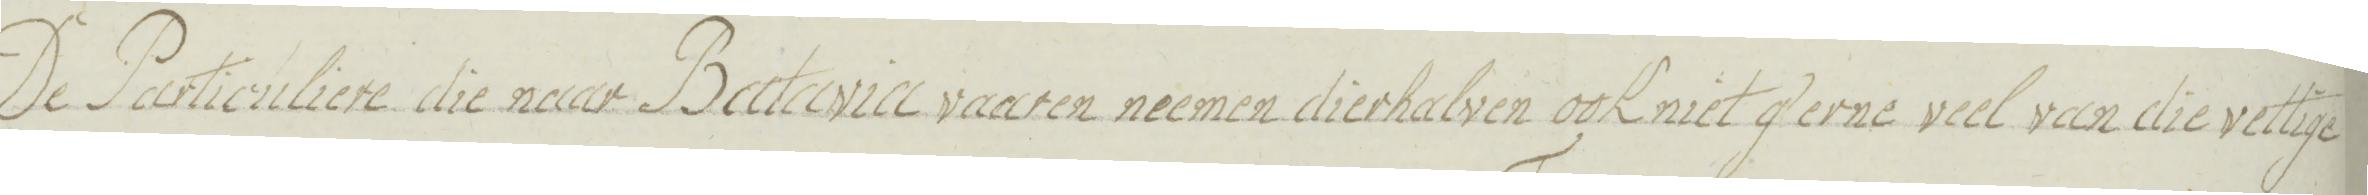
De Particuliere die naar Batavia vaaren neemen dierhalven ook niet g'erne veel van die vettige
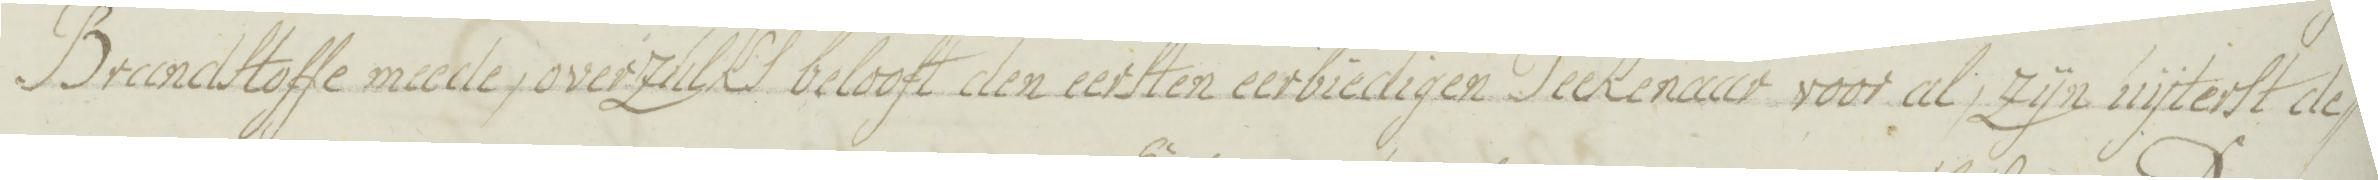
Brandstoffe meede, overzulks belooft den eersten eerbiedigen Teekenaar voor al, zijn uijterst de„
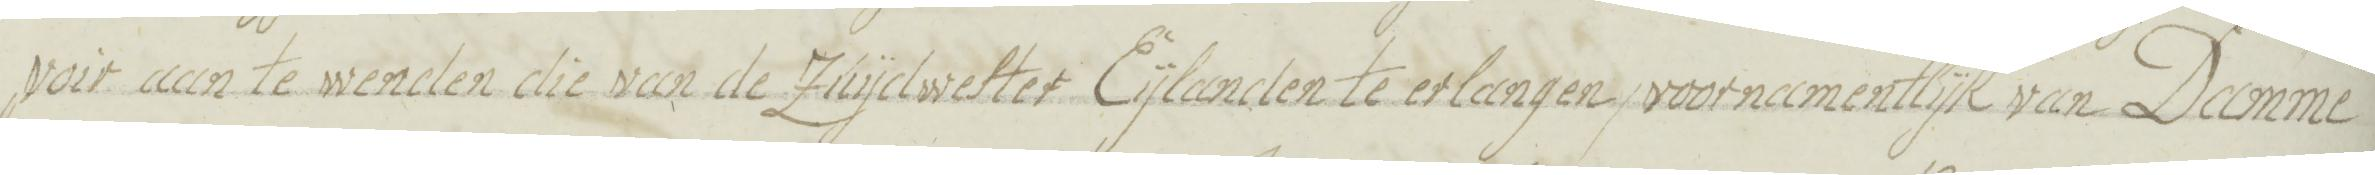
„voir aan te wenden die van de Zuijdwester Eijlanden te erlangen, voornamentlijk van Damme
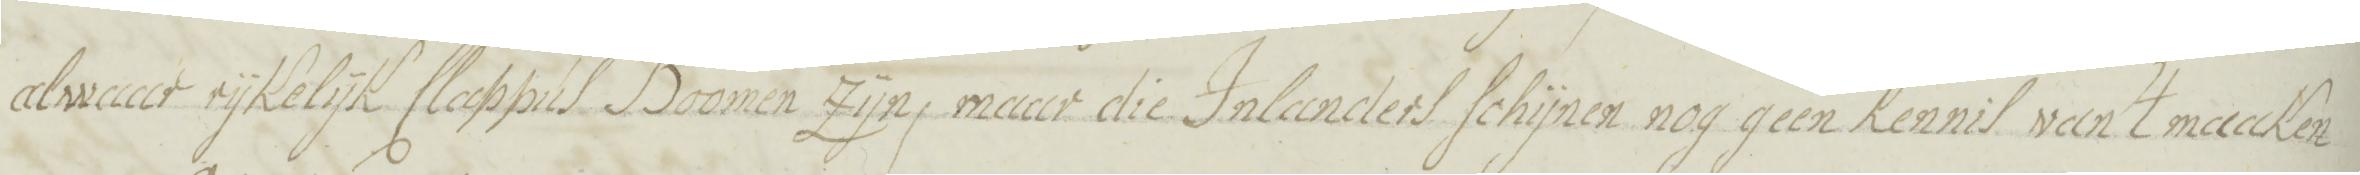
alwaar rijkelijk Clappus Boomen zijn, maar die Inlanders schijnen nog geen kennis van ’t maaken
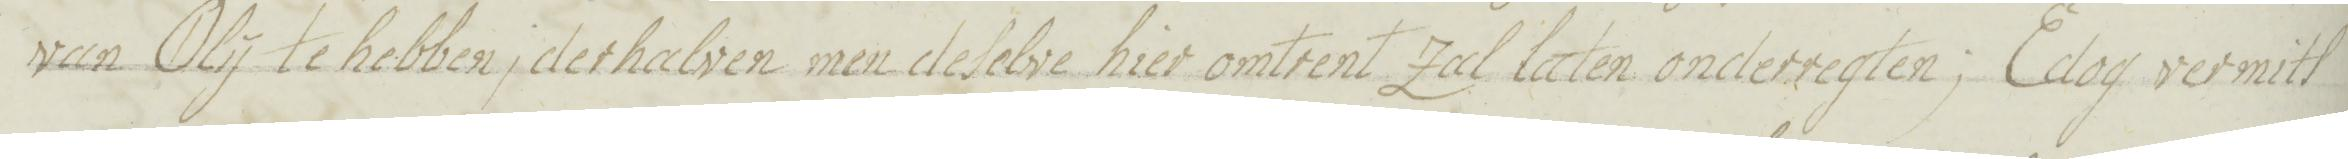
van Olij te hebben, derhalven men deselve hier omtrent zal laten onderregten; Edog vermits
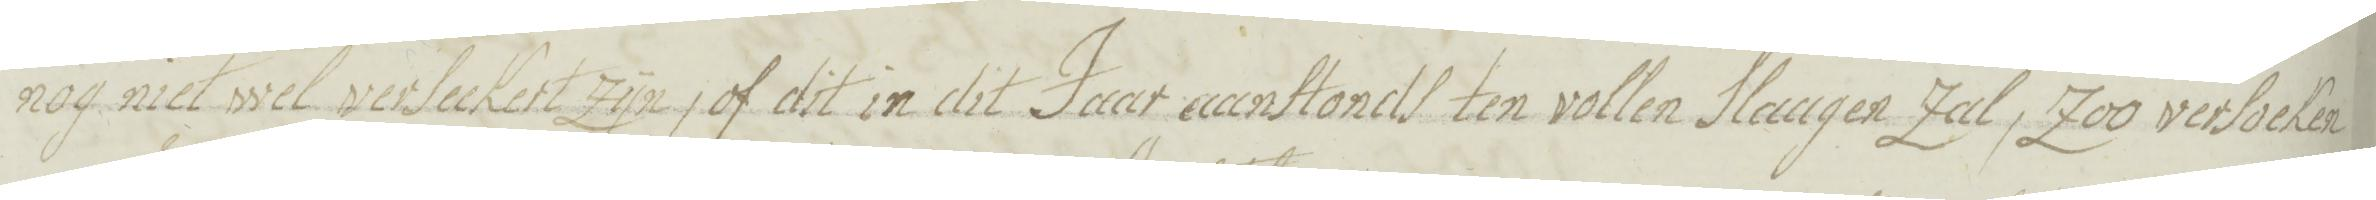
nog niet wel verseekert zijn, of dit in dit Iaar aanstonds ten vollen slaagen zal, zoo versoeken
